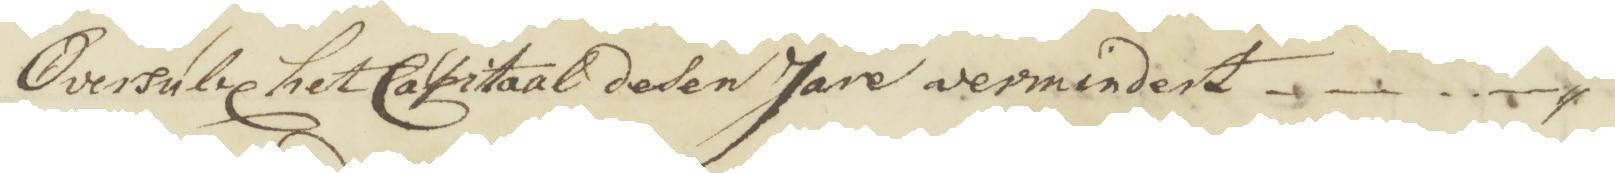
Oversulcx het Capitaal desen Jare vermindert - - - - - - - „ 513: 5: –
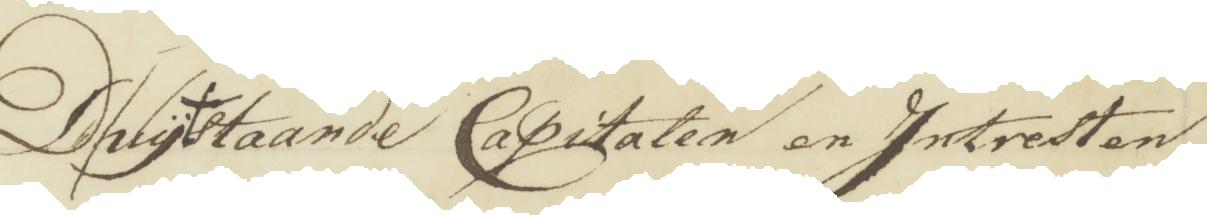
D/uijtstaande Capitalen en Jntresten
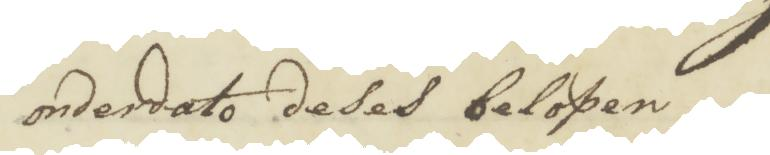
onderdato deses balopen . . . . . . rd„s 17953: 2: –
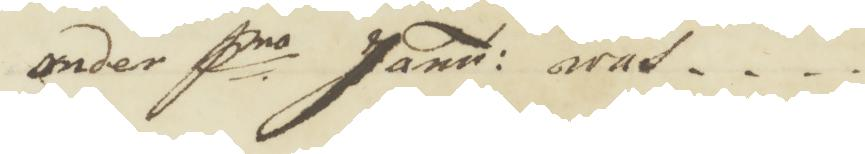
onder p=mo Janu: was - - - - - - - - „ 39308:39:¾.
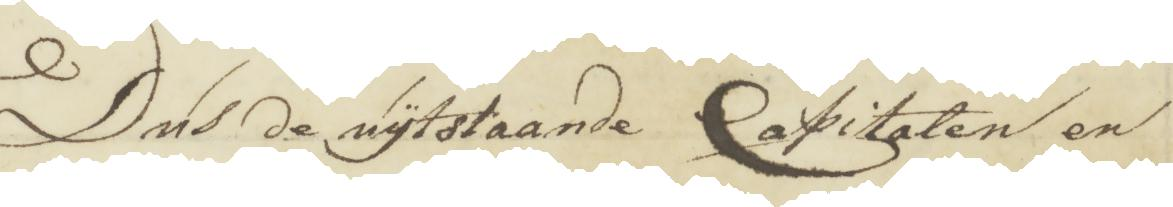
Dus de uijtstaande Capitalen en
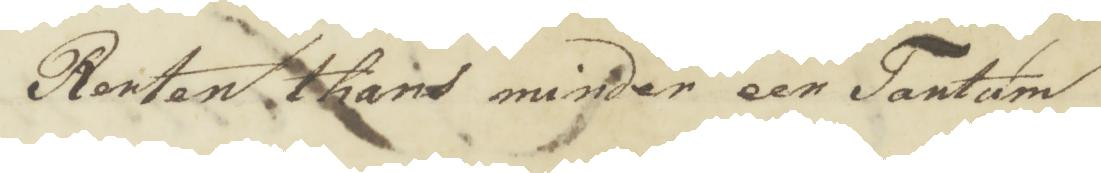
Renten thans minder een Tantum
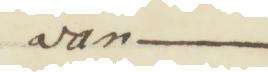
van - - - - - - - - - - - - - - - R.d„s 1355:37:¾.
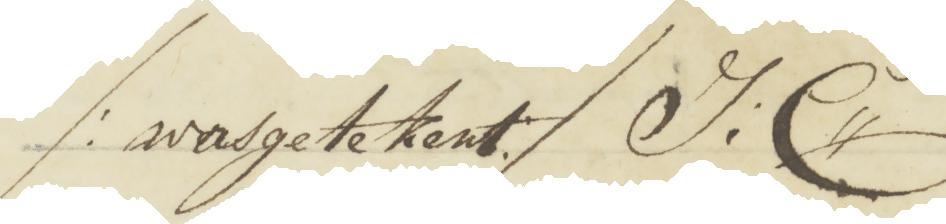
/: was getekent:/ J: C„s De Wind Diacon.
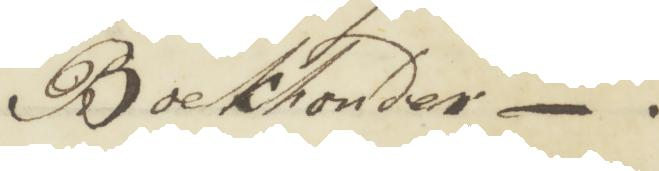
Boekhouder — .
